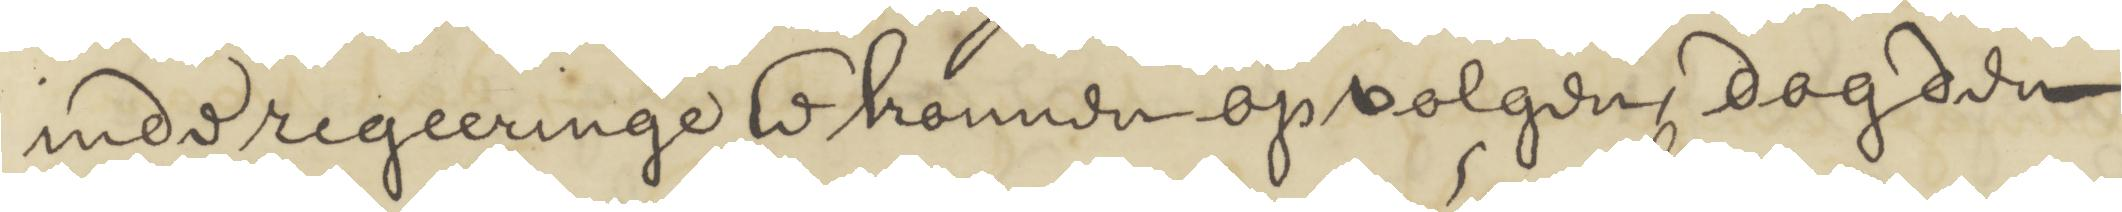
inde regeeringe te konnen opvolgen, dog den
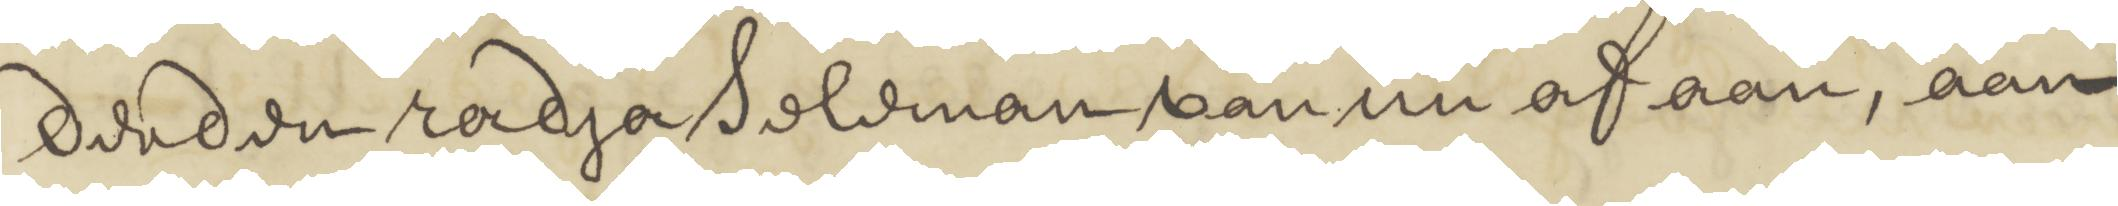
derden radja Seleman van nu af aan, aan
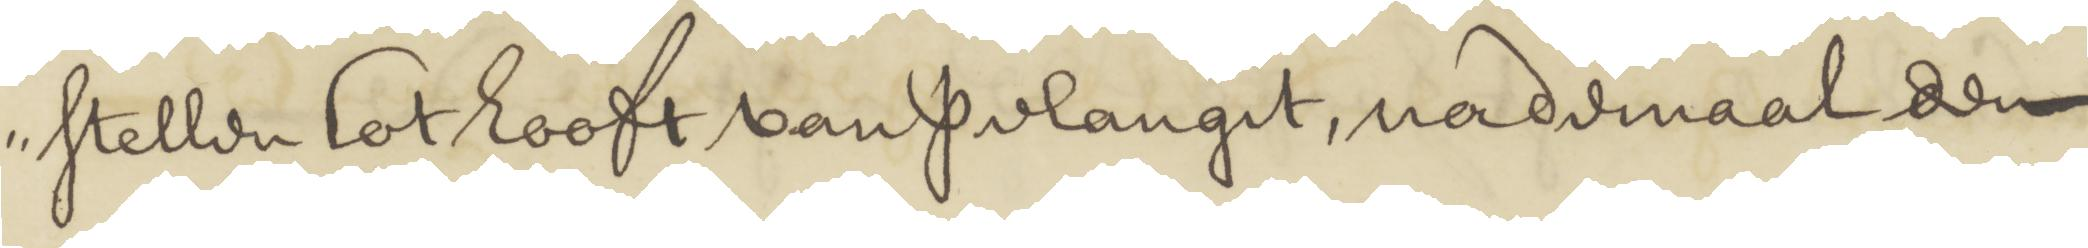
„stellen tot hooft van pelangit, nademaal den
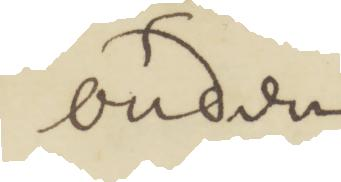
ouden
